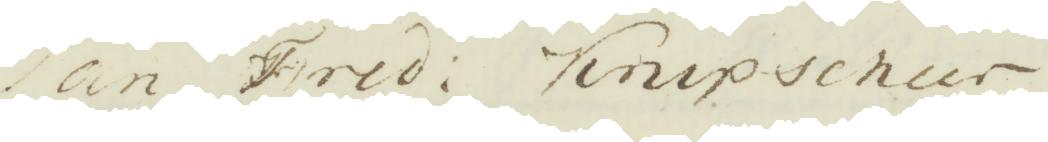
Ian Fred: Knipscheer
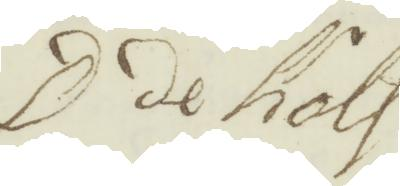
I D de Kolf
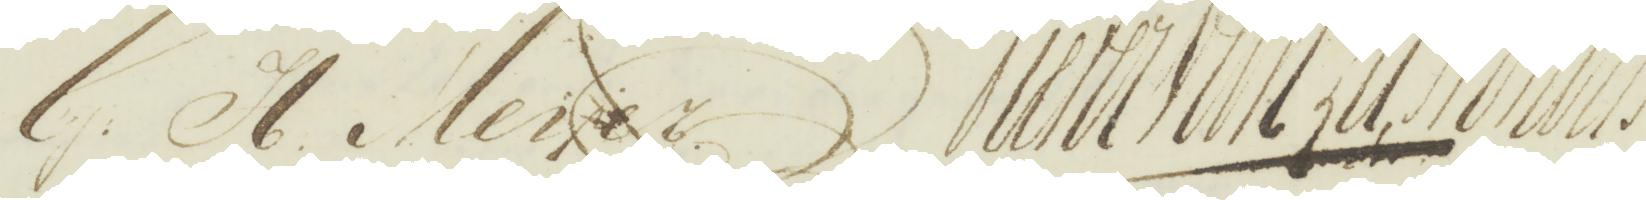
G: H. Meijer Pieter van Lee, notaris
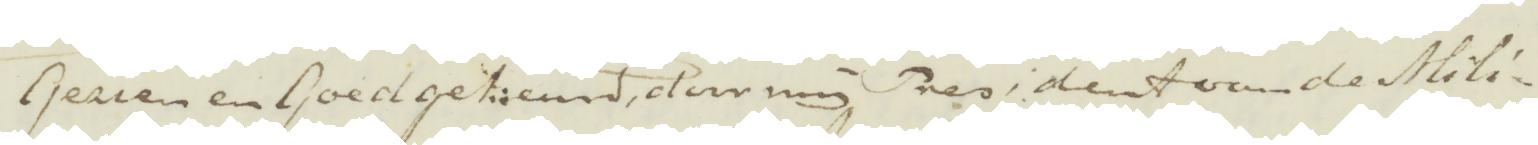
Gezien en Goedgekeurd, door mij President van de Mili=
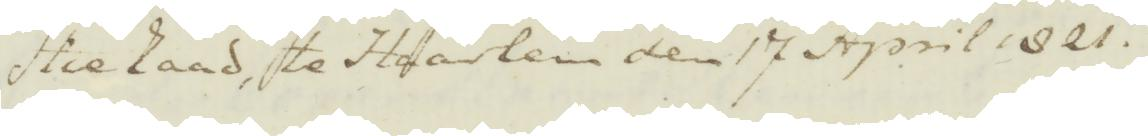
tie Raad, te Haarlem den 17 April 1821.
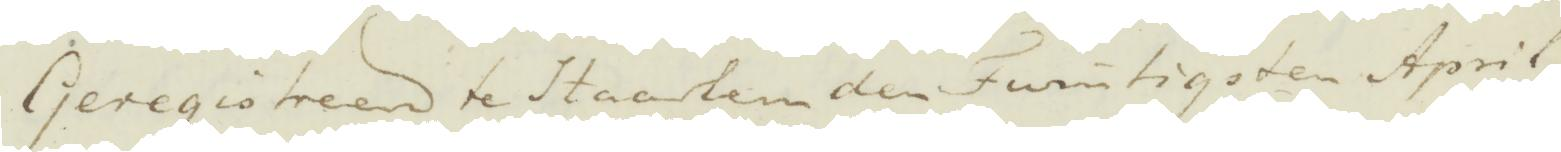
Geregistreerd te Haarlem den Twintigsten April
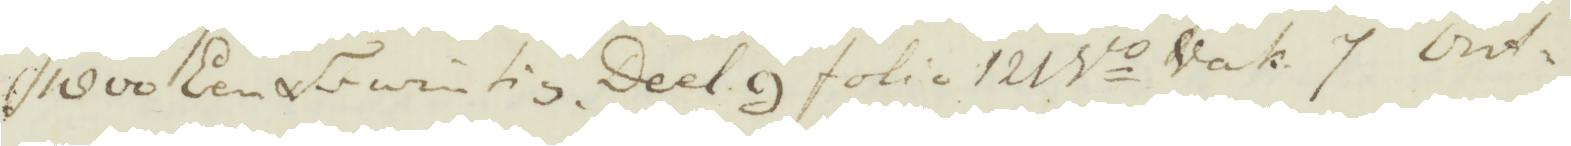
1800 Een&Twintig, Deel. 9 folio 121V=o Vak. 7 Ont:
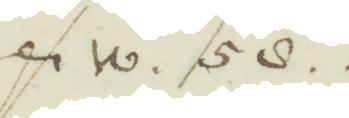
ƒ10:58.
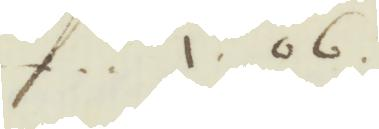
ƒ .. 1. 06.
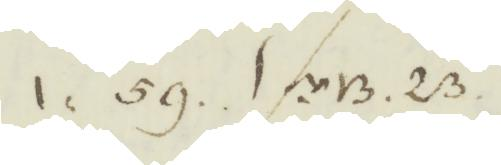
1: 59.. ƒ13.23.
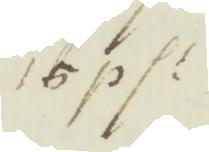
15 /c=t
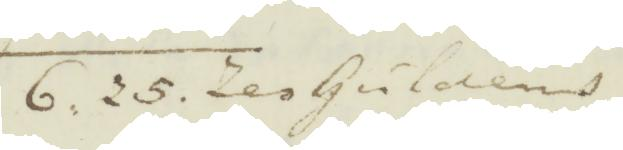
6„25. Zes Guldens
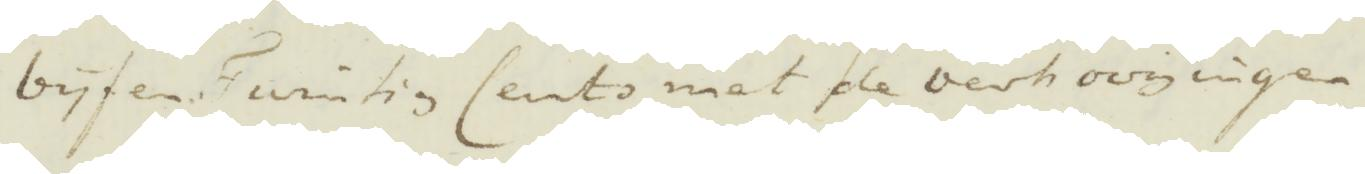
vijf en Twintig Cents, met de verhoogingen
